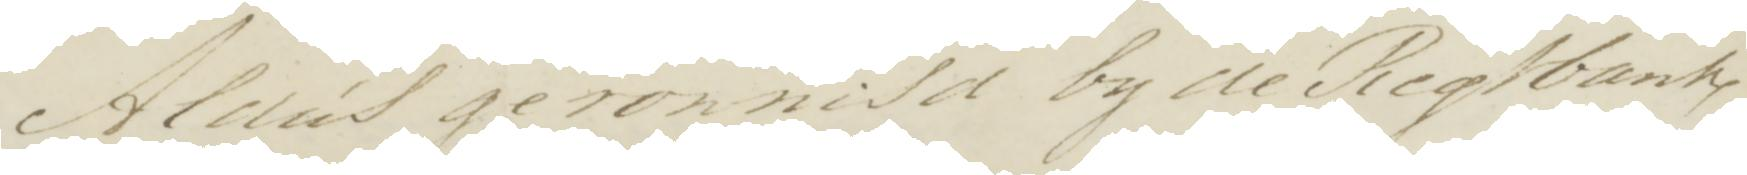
Aldus gevonnisd by de Regtbank
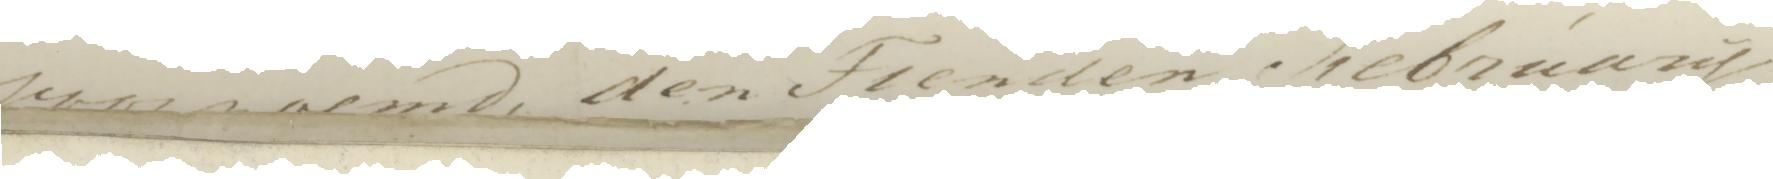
voornoemde den Tienden Februarij
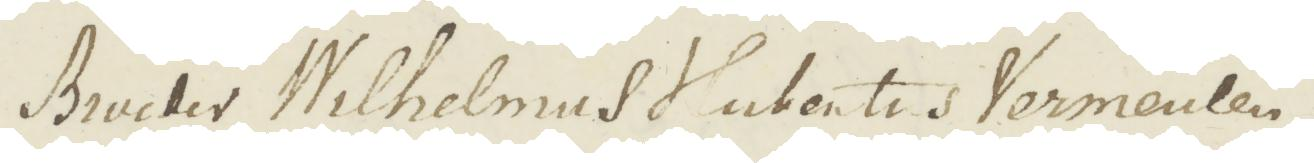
Broeder Wilhelmus Hubertis Vermeulen
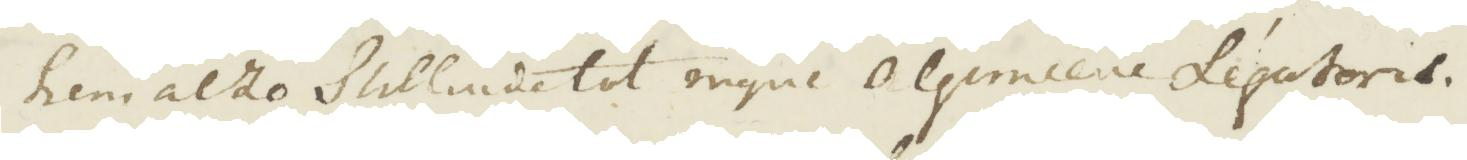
hem alzo stellende tot myne algemeene Legatoris.
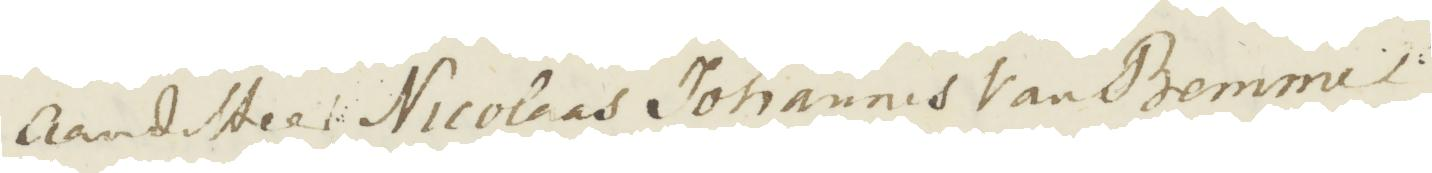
Aan de Heer Nicolaas Johannes van Bemmel
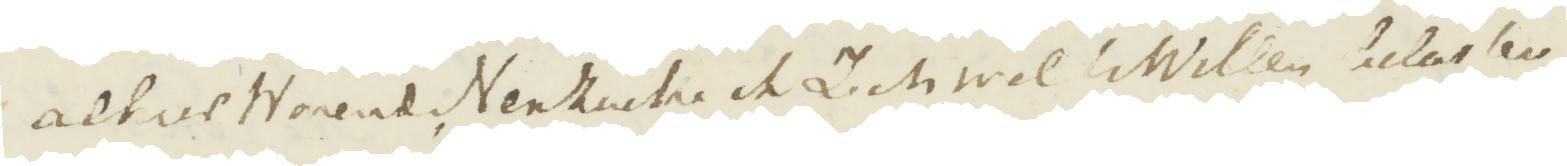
alhier Wonende, Verzoeke ik Zich wel te Willen belasten
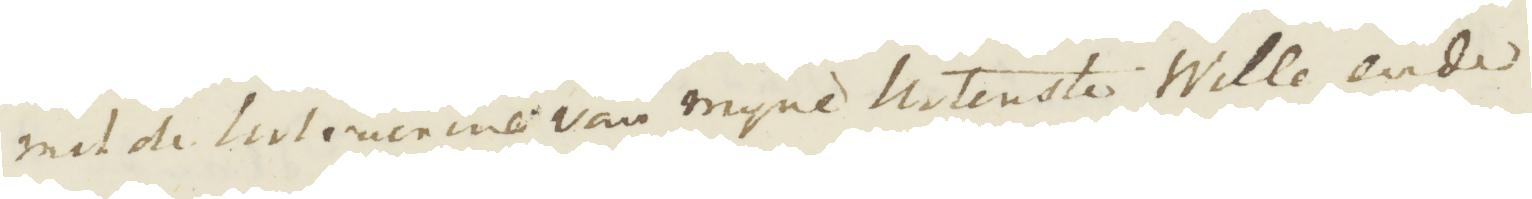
met de uitvoering van myne Uiterste Wille, en de
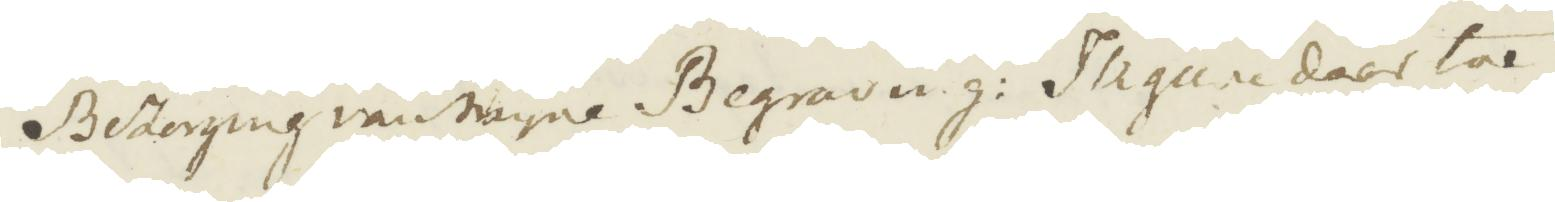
Bezorging van mijne Begraving: Ik geeve daar toe
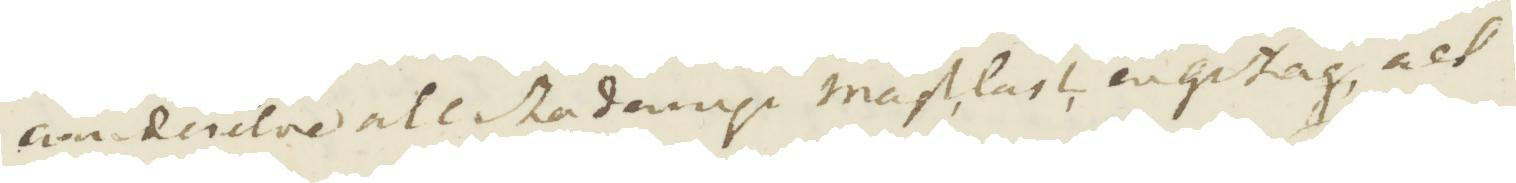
aan deselve alle zodanige magt, last en gezag, als
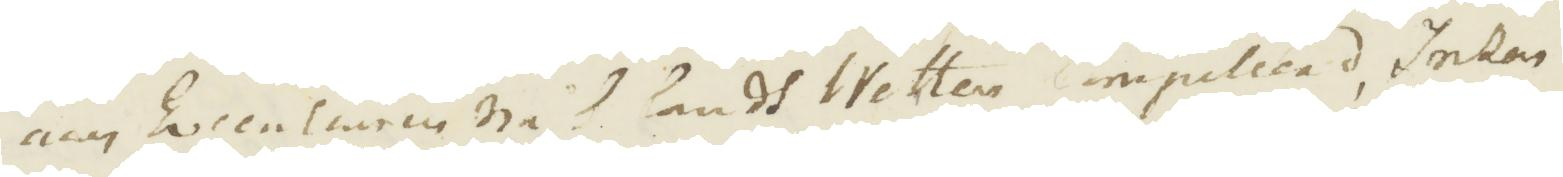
aan Executeuren na s lands Wetten Competeerd, Inzon
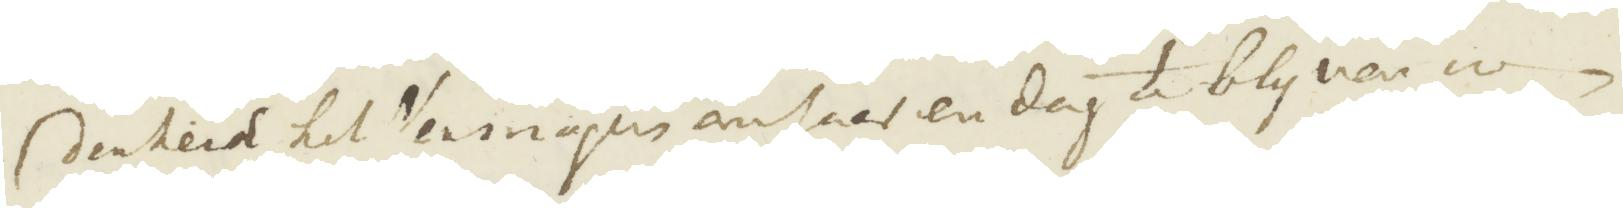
derheid het Vermogen om Jaar en dag te blyven in
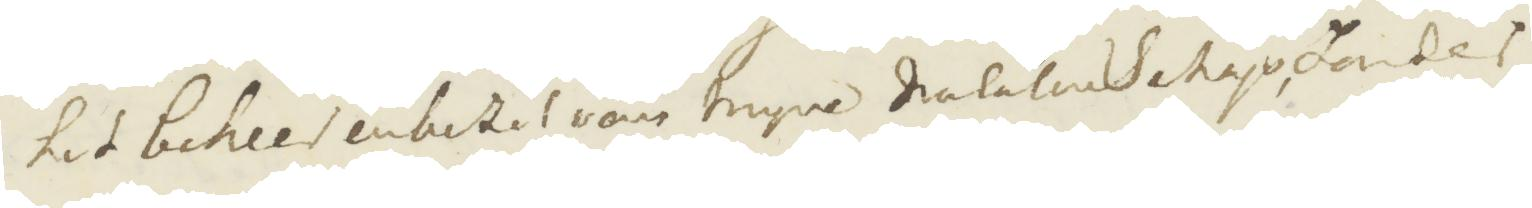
het beheer en bezit van myne nalatenschap, zonder
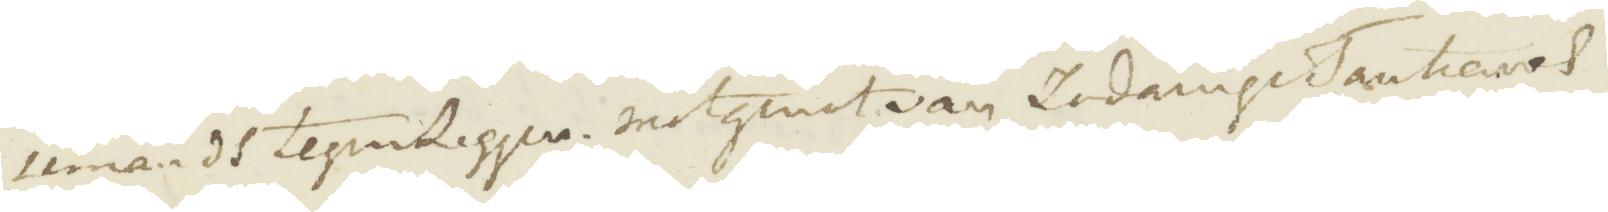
iemands tegenzeggen; met genot van zodanige Tautienes
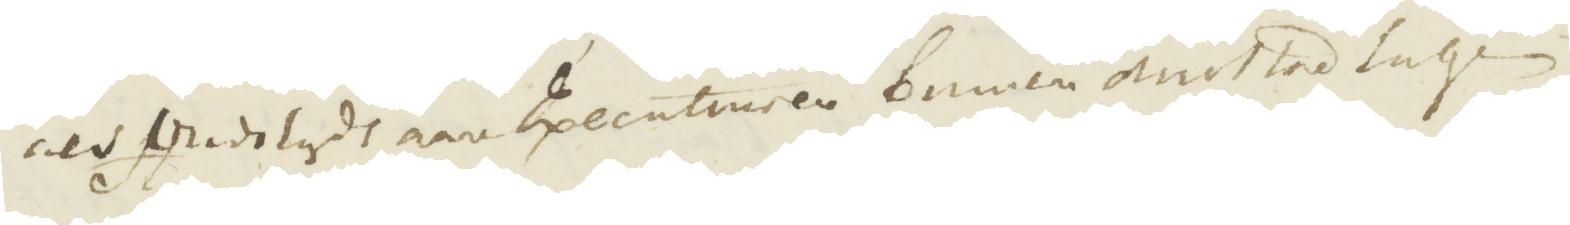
als Hiertyds aan Executeuren binnen den stad Inge
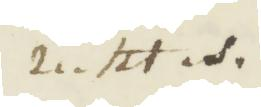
reckt is.
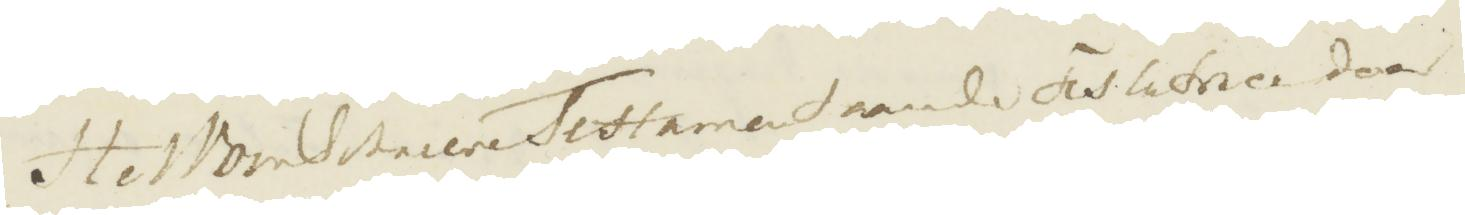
Het Voorschreeve Testament aan de Testateur door
